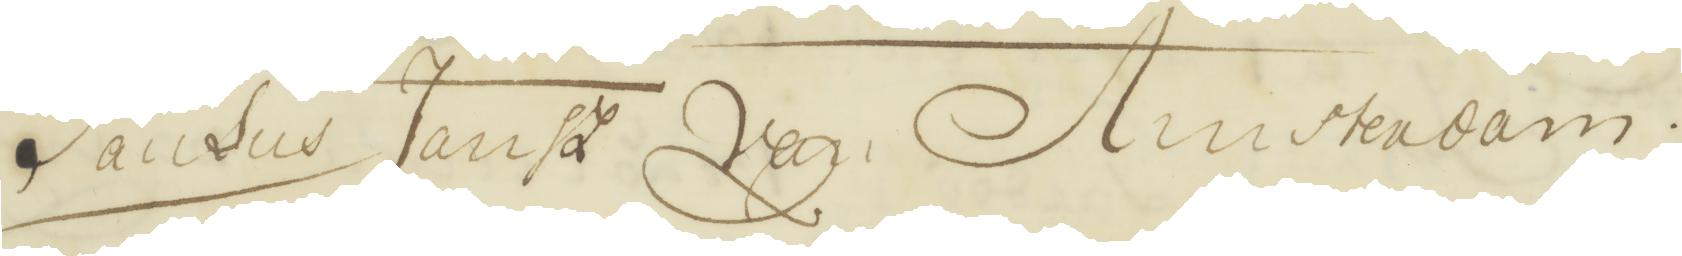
Paulus Jansz van Amsterdam.
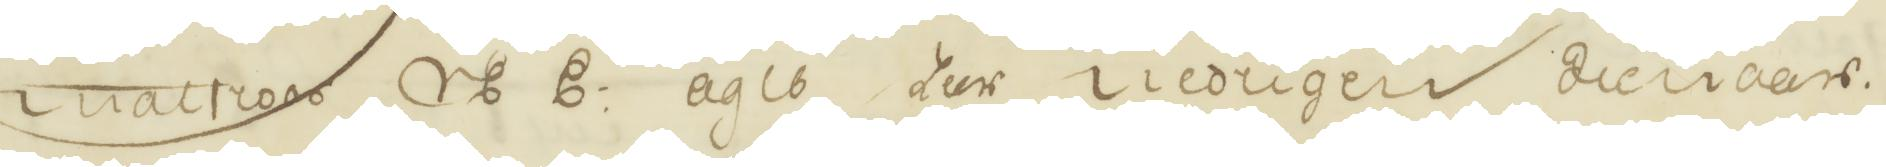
mattroos VE E: agtb zeer nedrigen dienaar.
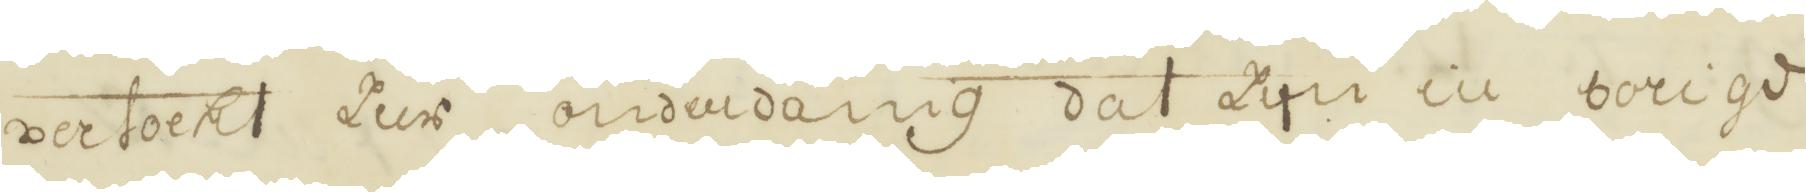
versoekt zeer onderdanig dat zyn in vorige
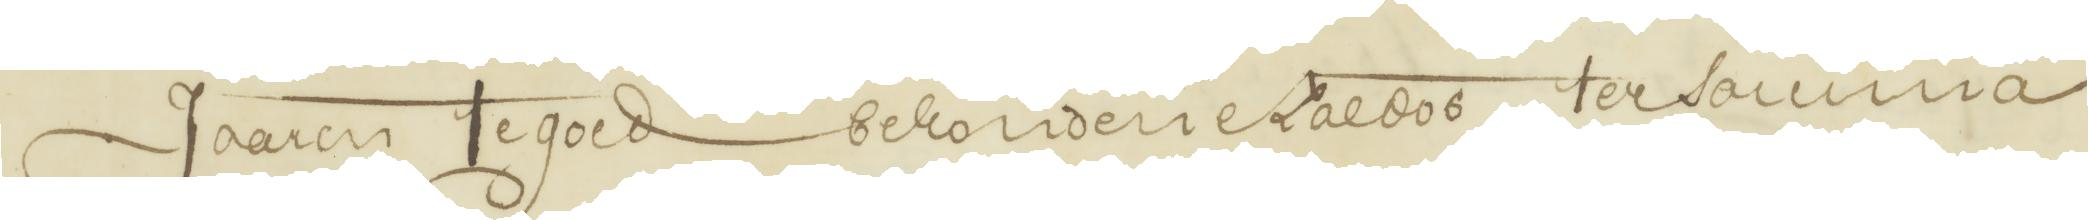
Jaaren te goed behouden zaldos ter somma
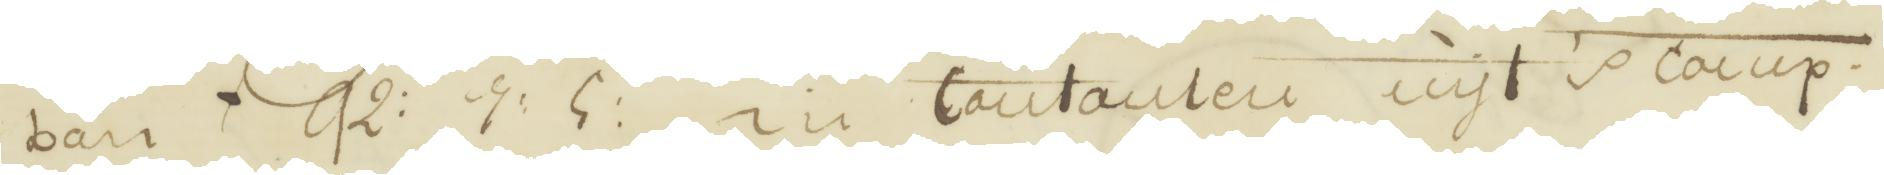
van 42: 7: 5: in contanten uijt 's Comp.
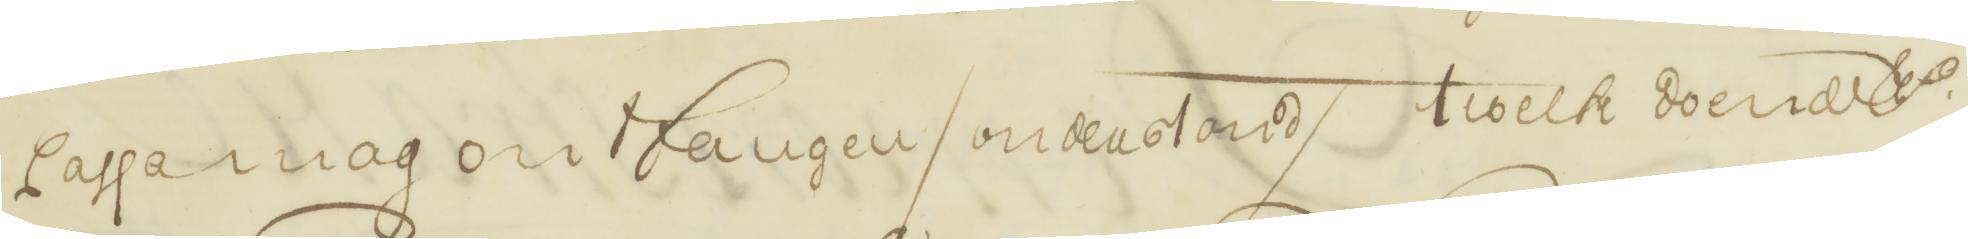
Cassa mag ontfangen /onderstond/ twelk doende &.a
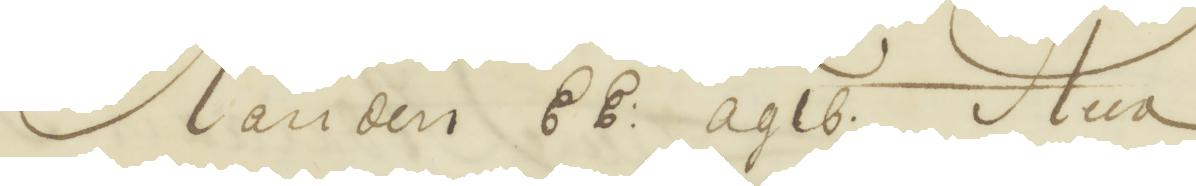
Aan den EE: agtb: Heer
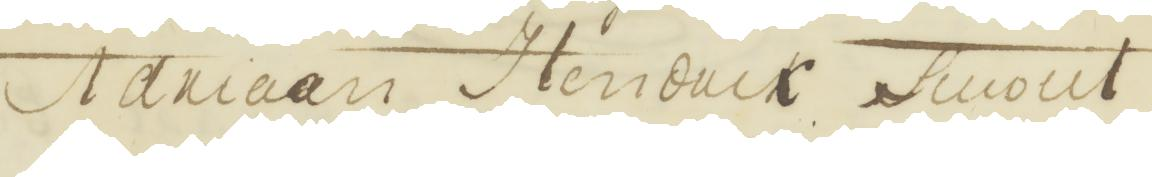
Adriaan Hendrik, Smout
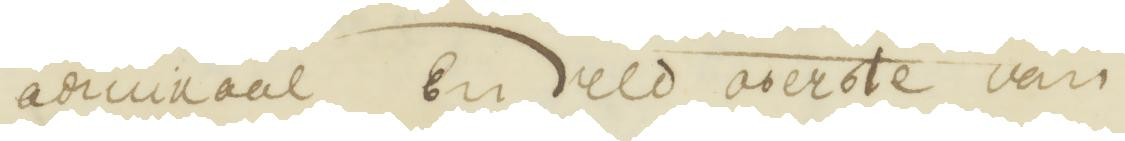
admiraal En veld overste van
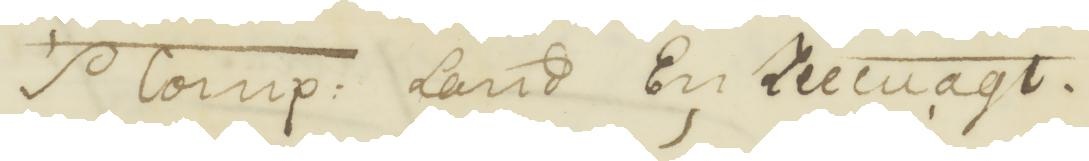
's: comp: land En zeemagt.
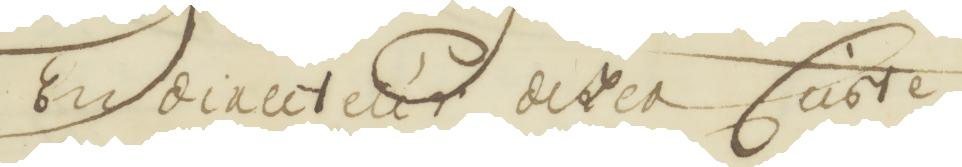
En directeur dezer Custe
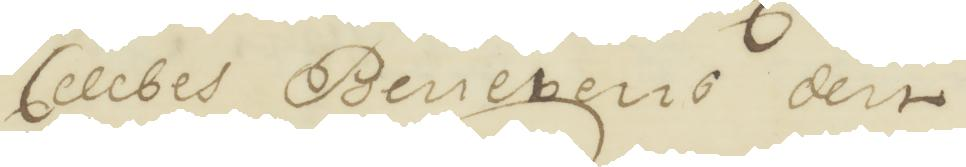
Celebes Benevens den
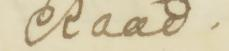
Raad.
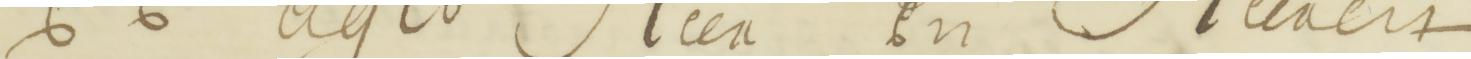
E E agtb Heer En Heeren
